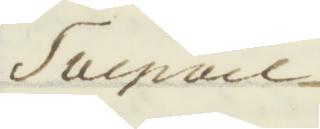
Toepoel
